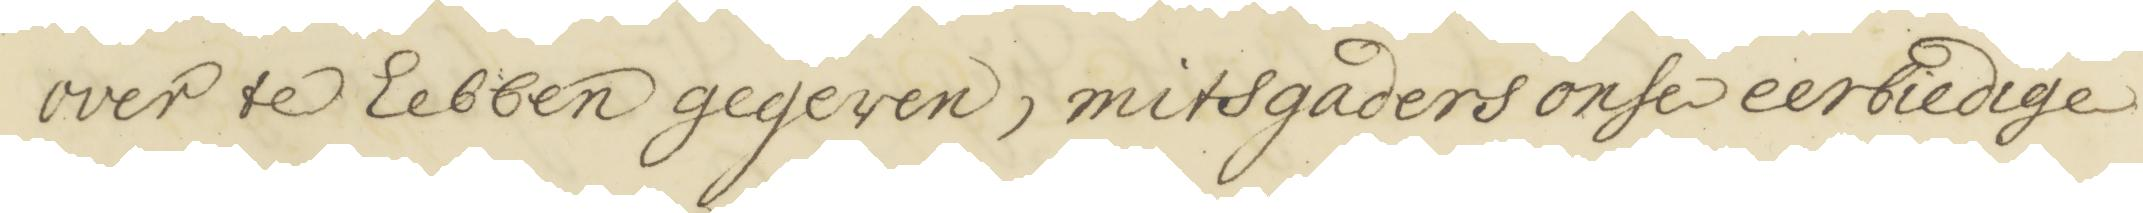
over te hebben gegeven, mitsgaders onse eerbiedige
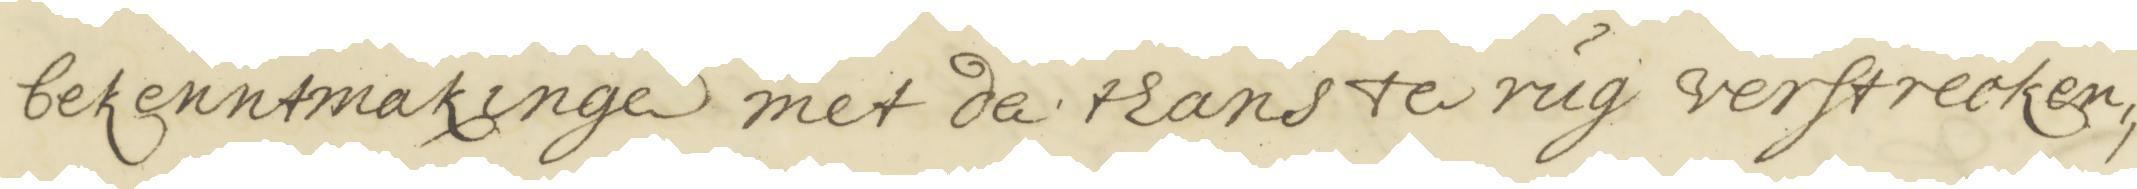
bekenntmakinge met de thans te rug verstrecken
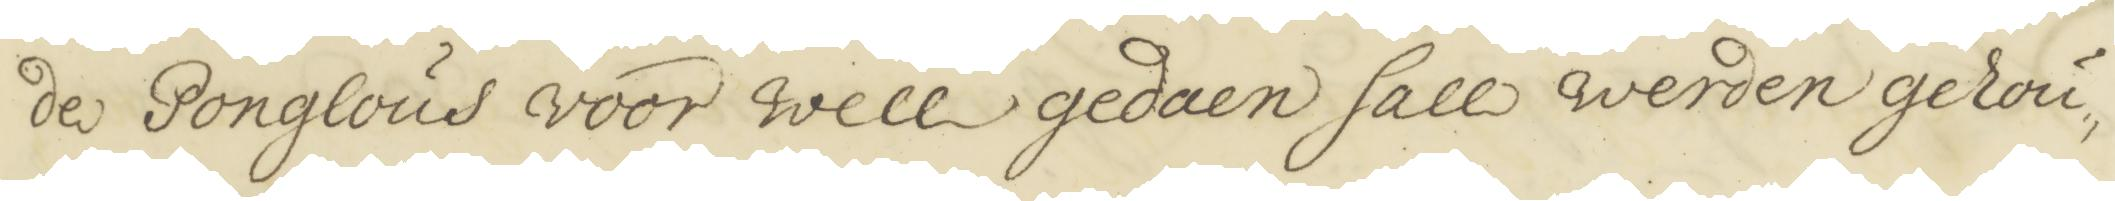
den Ponglous voor well gedaen sall werden gehou„
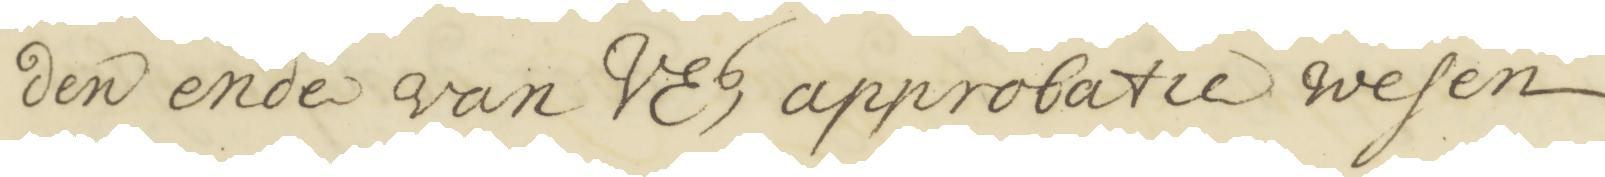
den ende van VE,s approbatie wesen
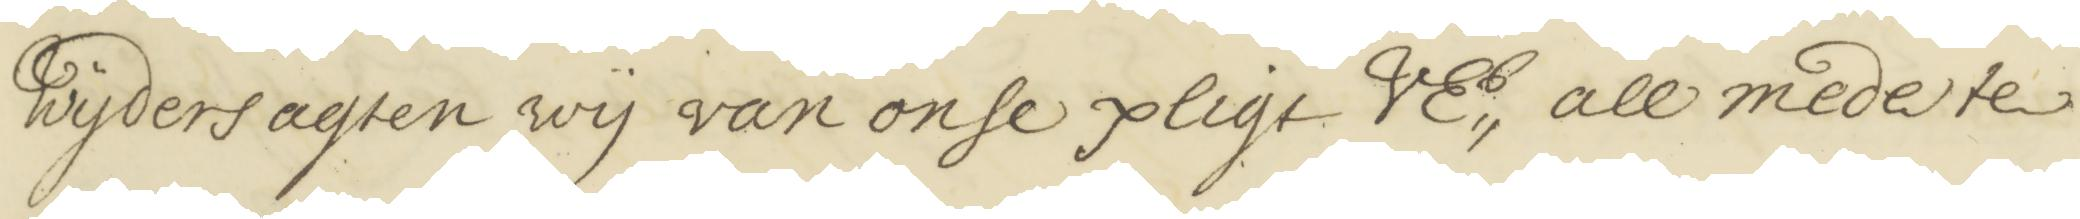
wijders agten wij van onse pligt VE„s all mede te
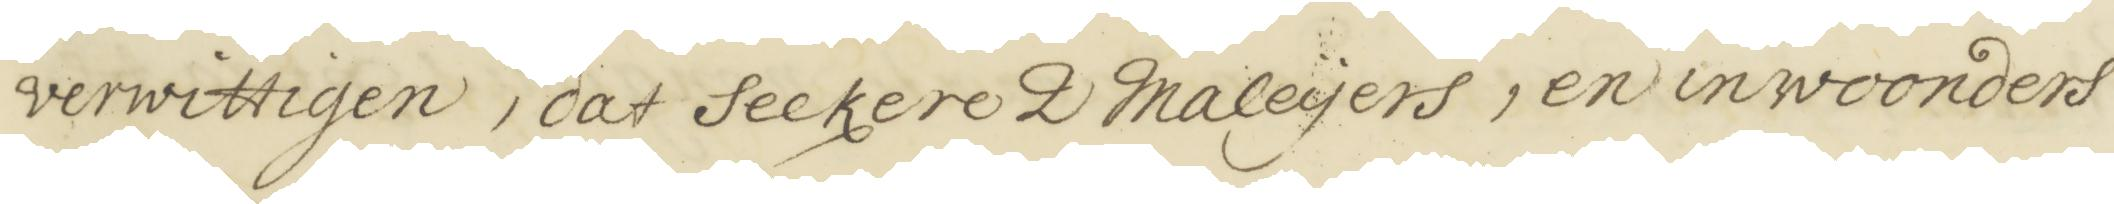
verwittigen, dat seekere 2 maleijers, en inwoonders
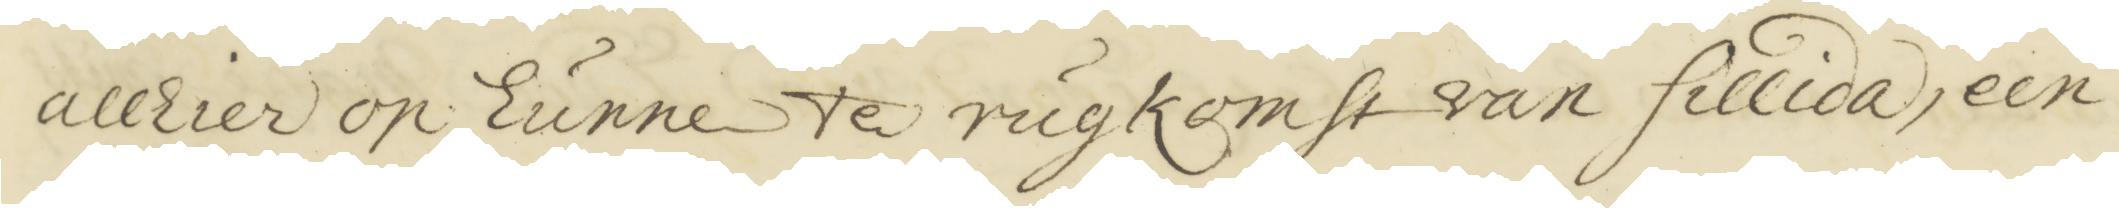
allhier op hunne te rugkomst van sillida, een
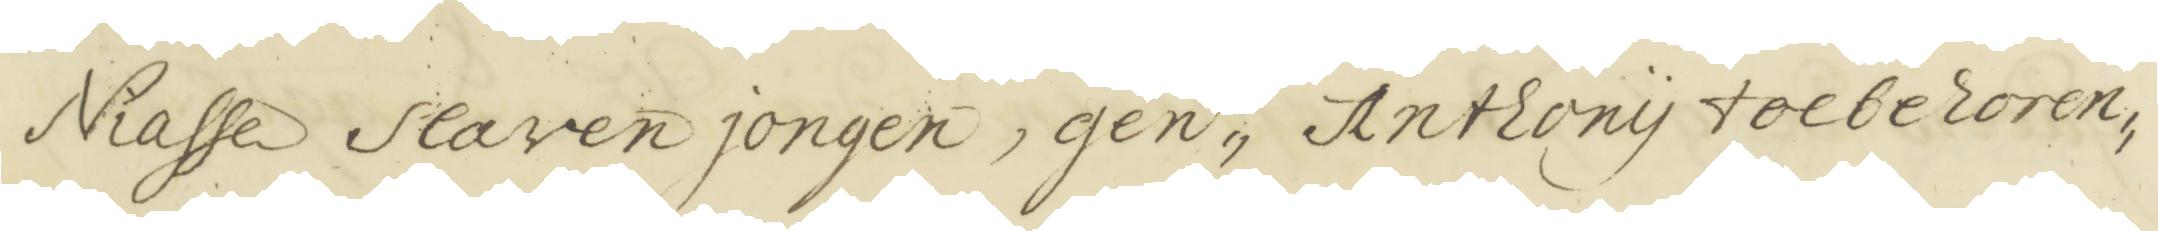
Niasse slaven jongen, gen„t Anthonij toebehoren„
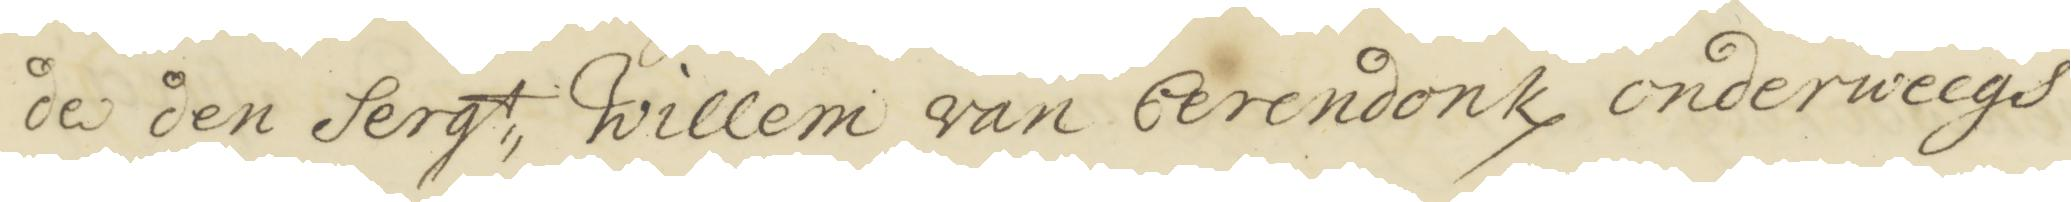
de den serg„t willem van berendonk onderweegs
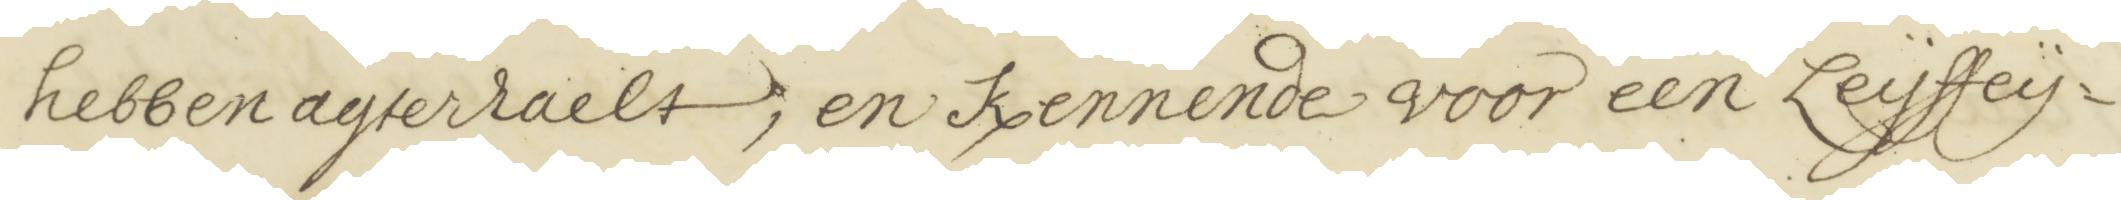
hebben agterhaelt; en kennende voor een Leijffeij=
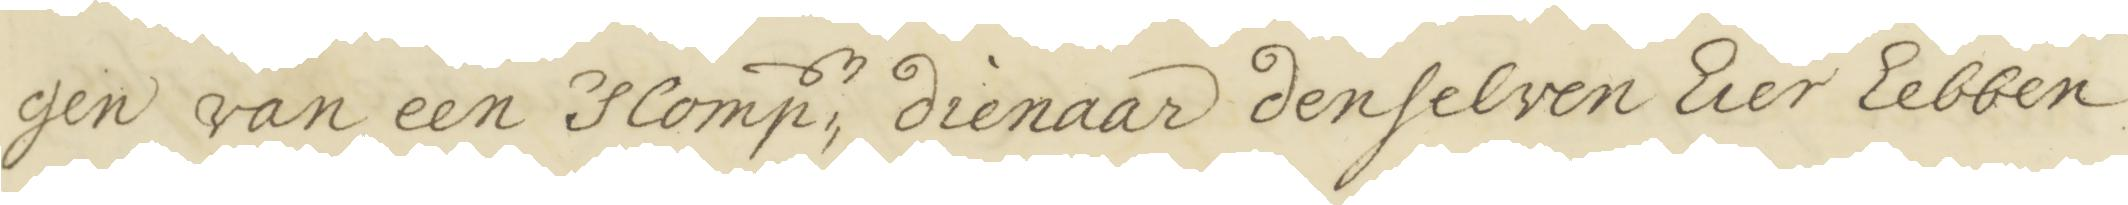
gen van een ’s Comp„s dienaar denselven hier hebben
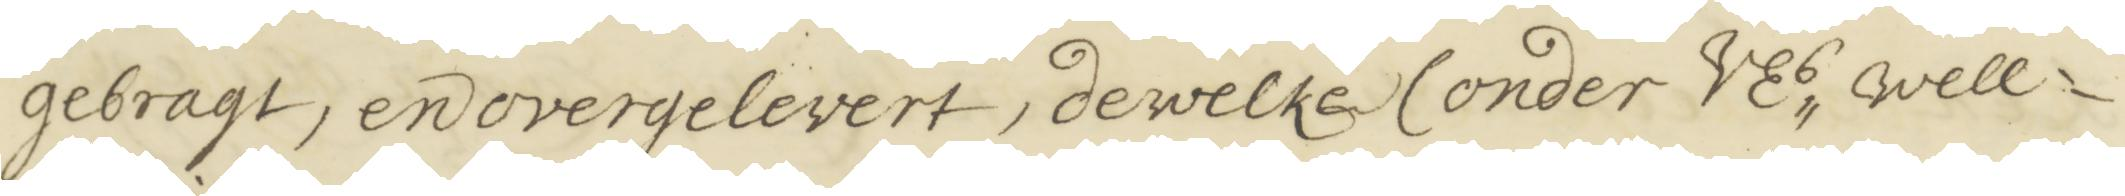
gebragt, en overgelevert, dewelke (onder VE„s well=
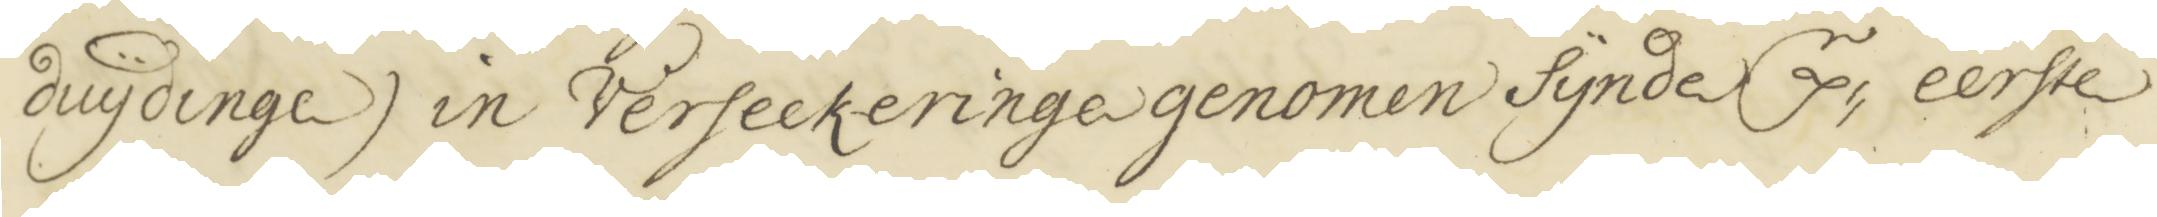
duijdinge) in verseekeringe genomen sijnde p„r eerste
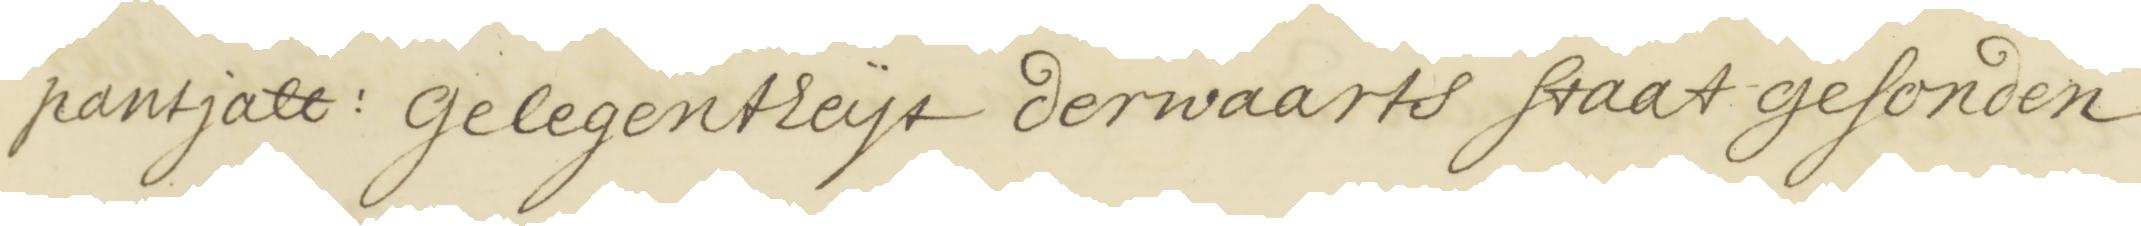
pantjall: gelegentheijt derwaarts staat gesonden
